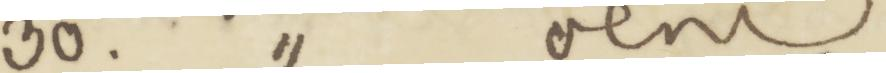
30. „ olie
